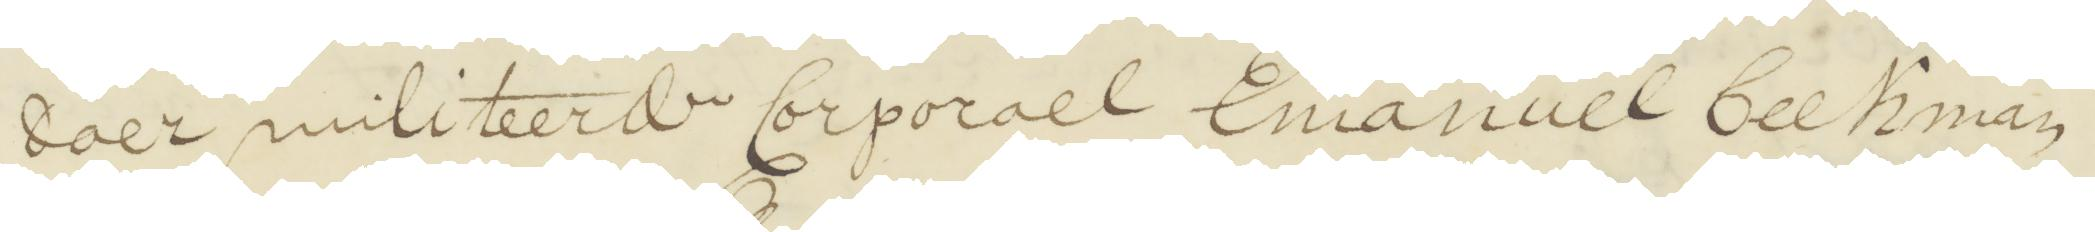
daer militeerde Corporael Emanuel beekman
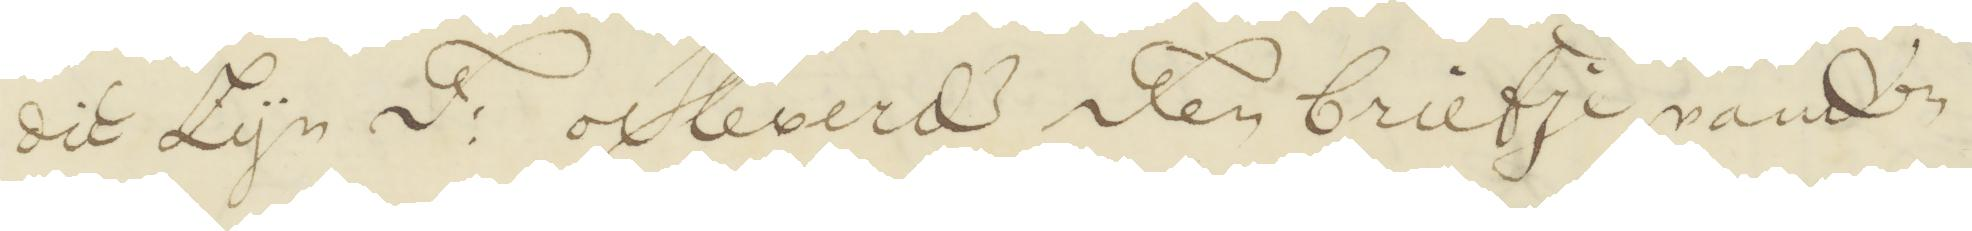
dit zijn E: overleverde Een briefje vanden
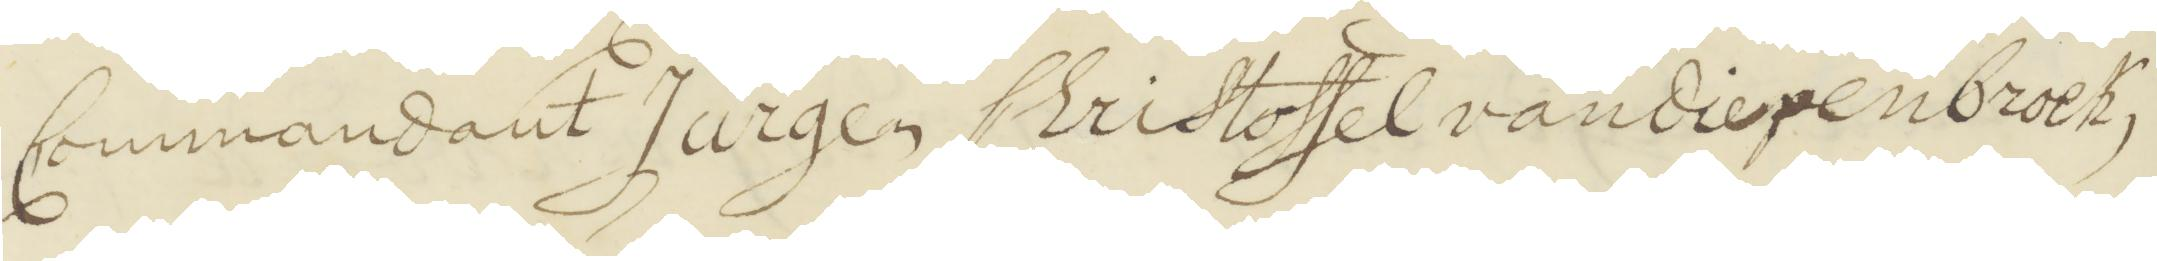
Commandant Jurgen Christoffel van diepenbroek,
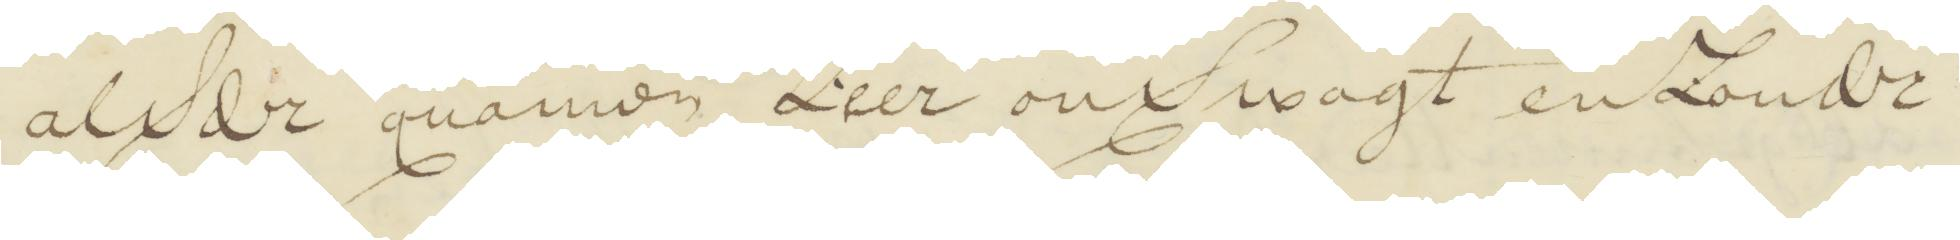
alverder quamen zeer onverwagt en zonder
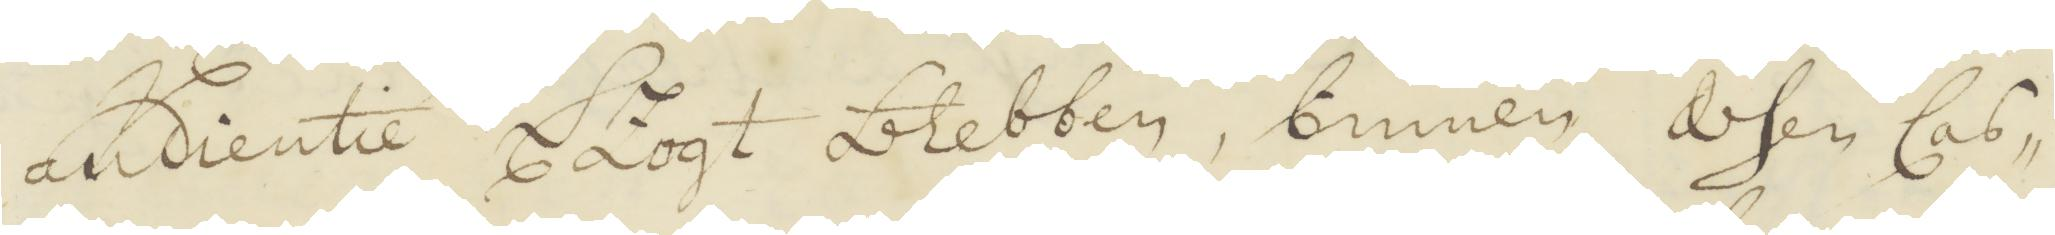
audientie verzogt te hebben, binnen desen Cas„
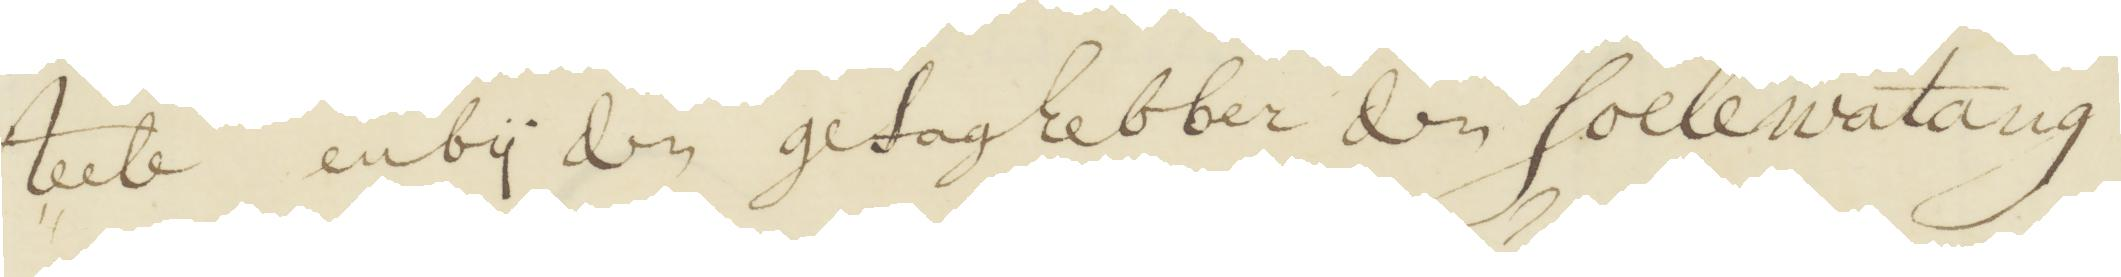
„teele en bij den gesaghebber den Soelewatang
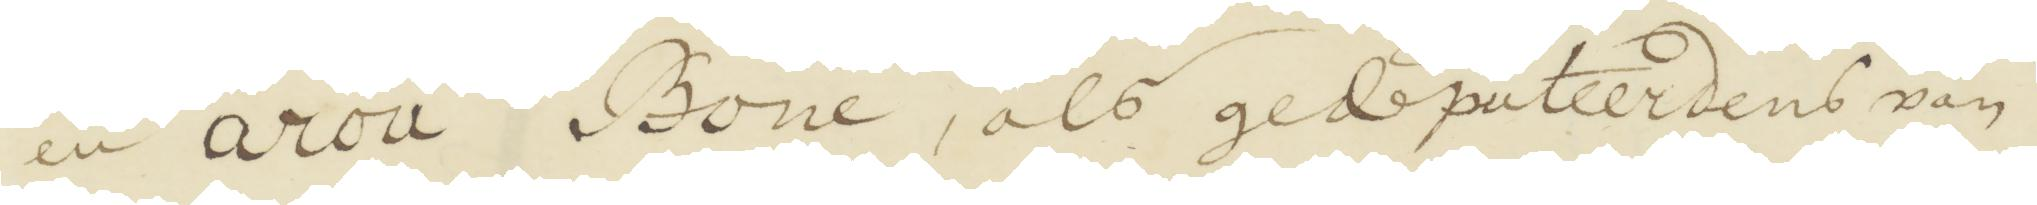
en arou Bone, als gedeputeerdens van
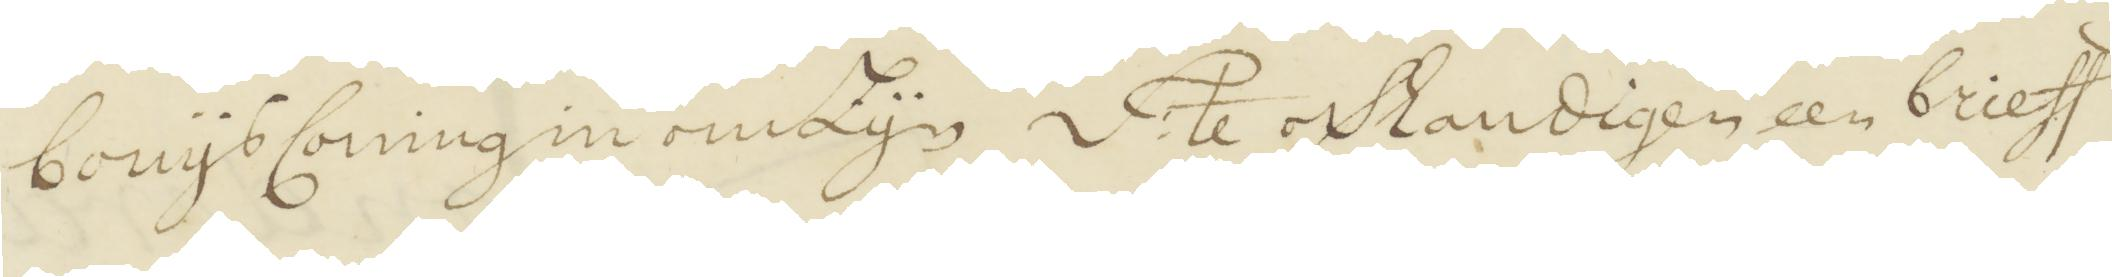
bouijs Coning in om zijn E: te overhandigen een brieff
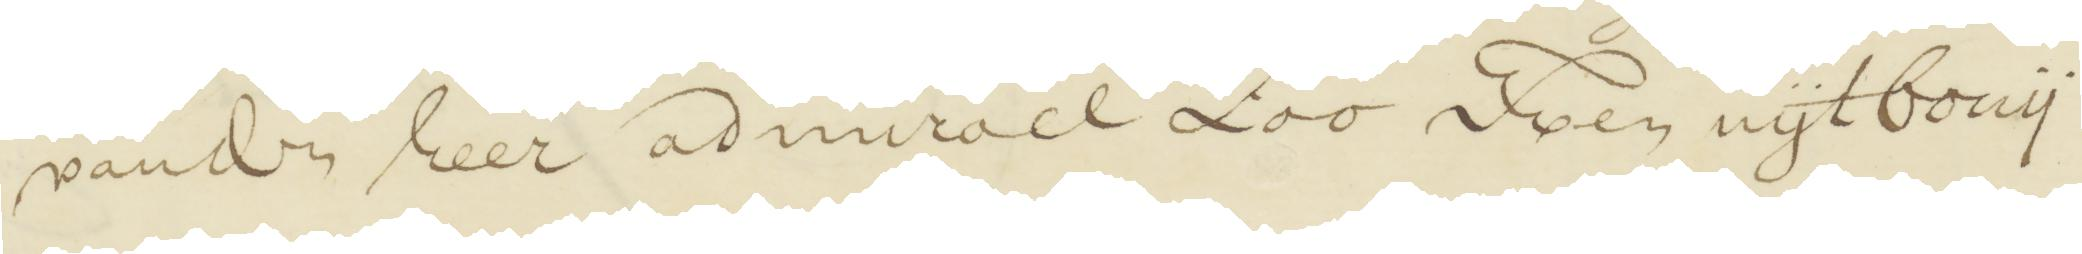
van den heer admirael zoo Even uijt bonij
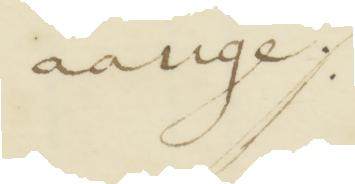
aange./.
